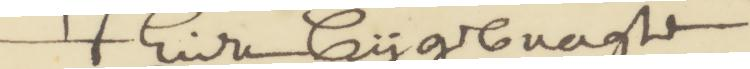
’t hier bij gebragte
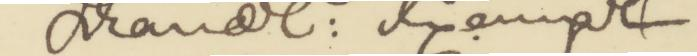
schandel: Exempel
